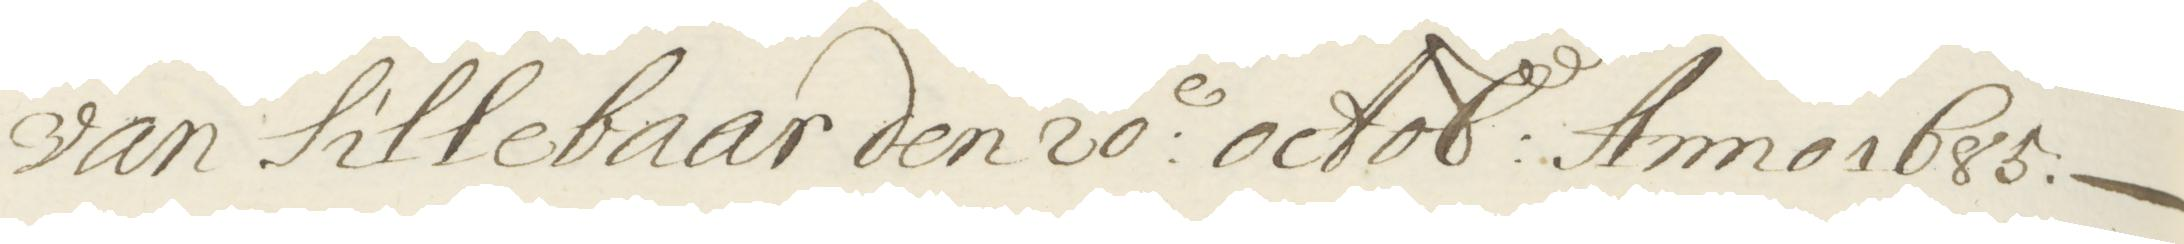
van Sillebaar den 20:e octob: Anno 1685: —
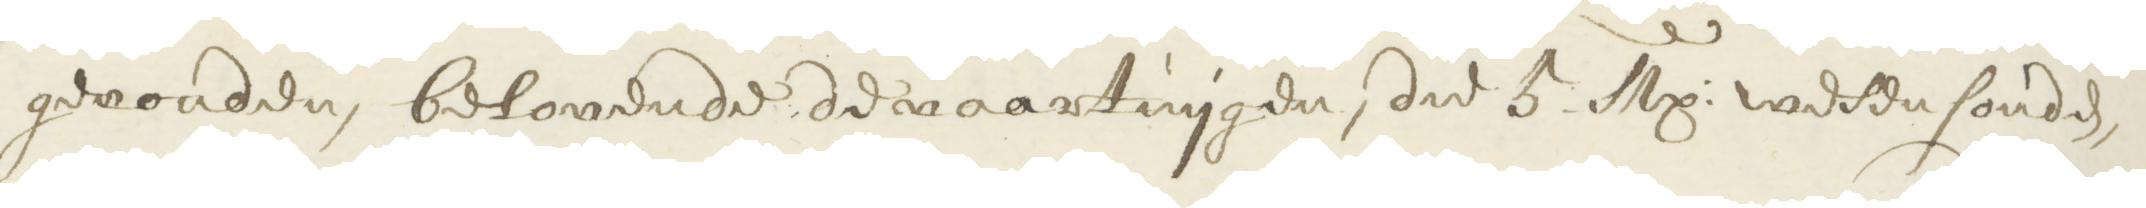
gevonden, belovende, de vaartuijgen, die 5: stx: wesen souden,
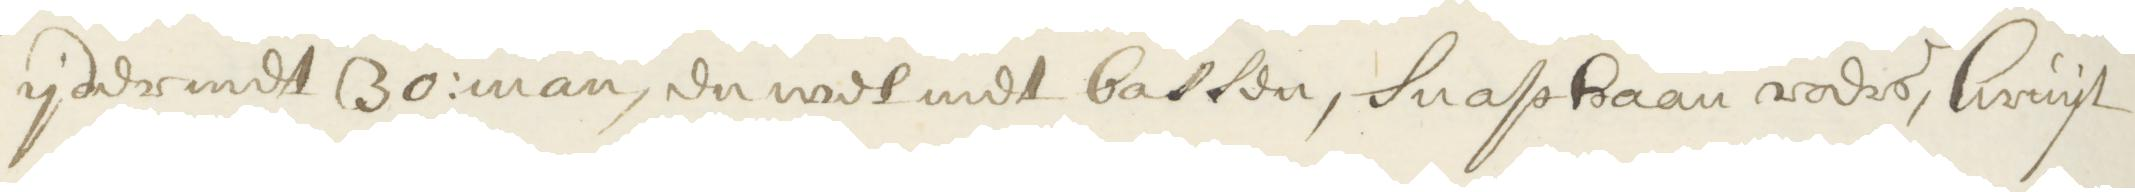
ijder met 30: man, en wel met bassen, snaphaan voers, kruijt
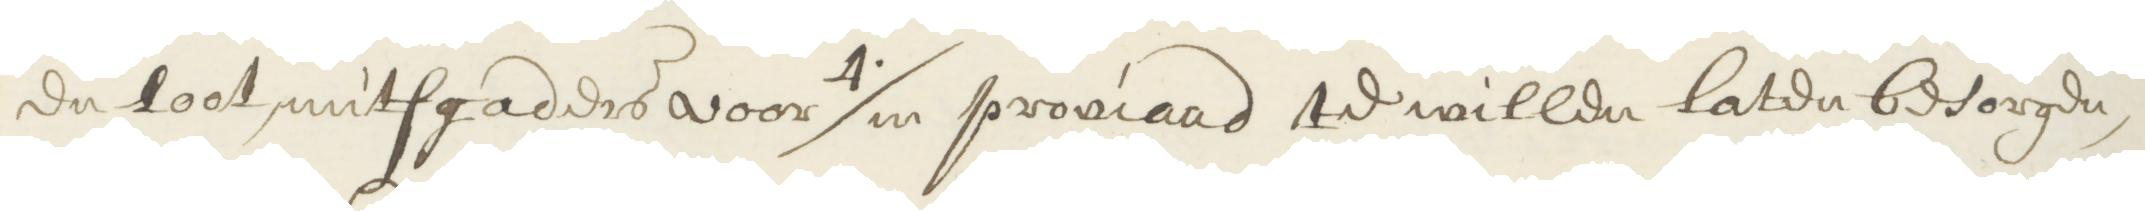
en loot, mitsgaders voor 4./m proviaad te willen laten besorgen,
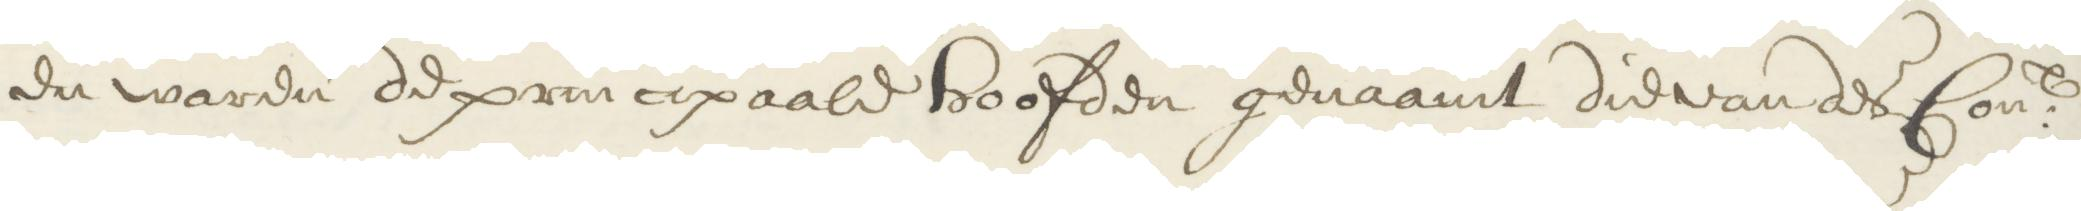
en waren de principaale hoofden genaamt die van des Con:x
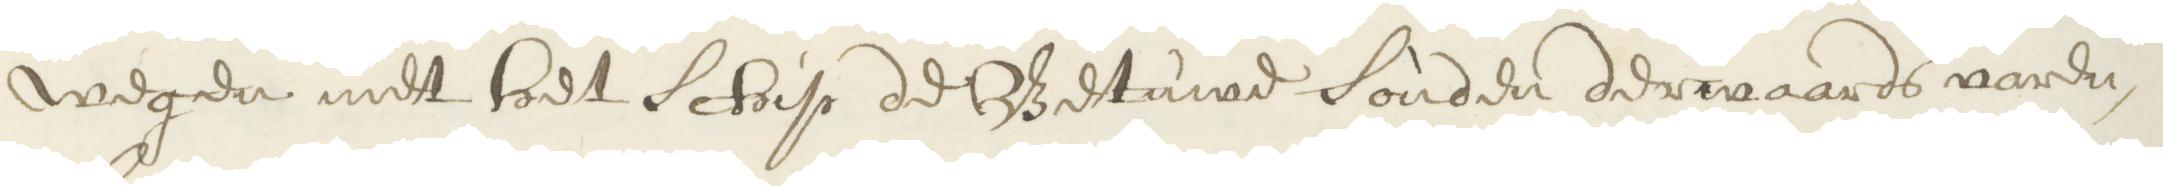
wegen met het schip de Betuwe souden derwaards varen,
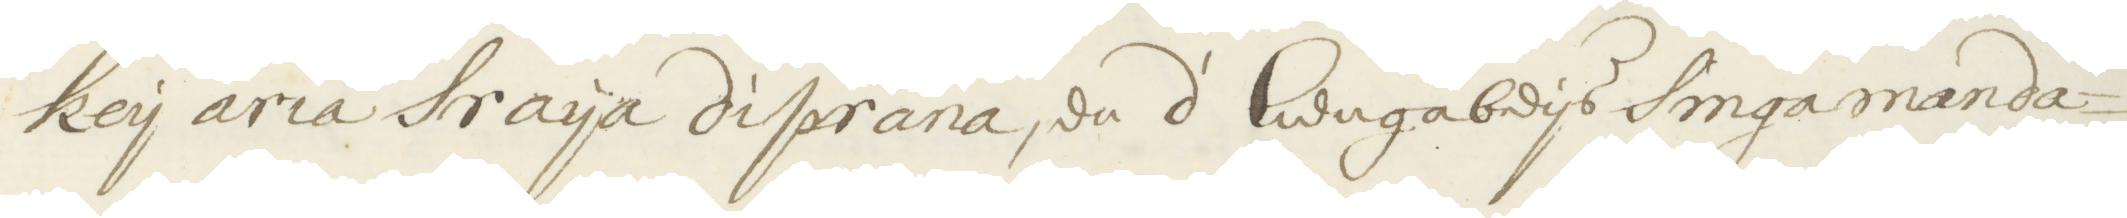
keij aria Sraija diprana, en d' kengabeijs singamanda=
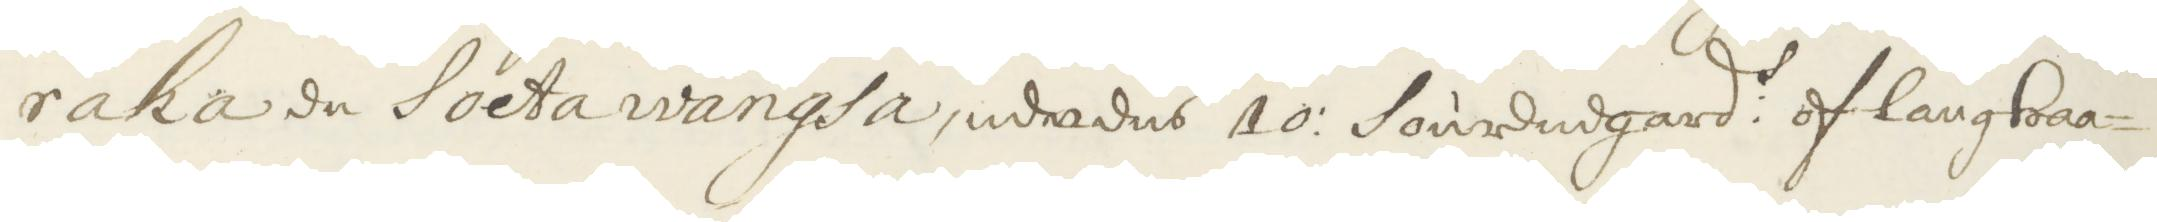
raka en soetawangsa, nevens 10: sourenegard:s of langhaa=
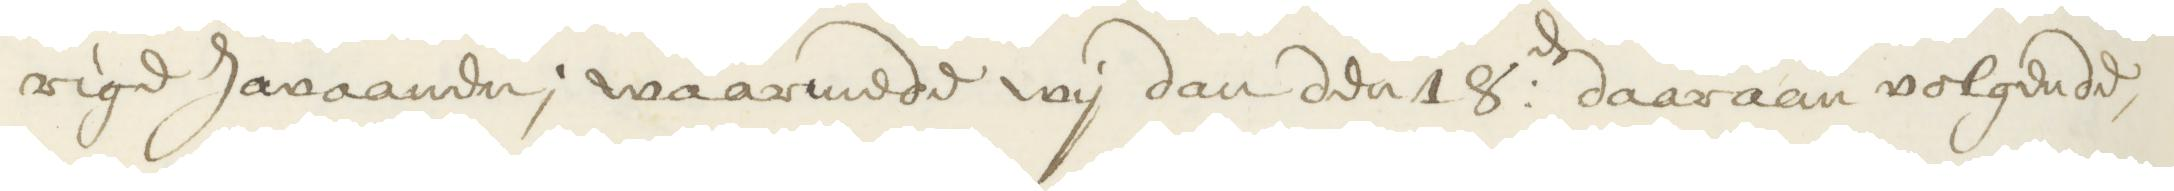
rige Javaanen; waarmede wij dan den 18:en daaraan volgende,
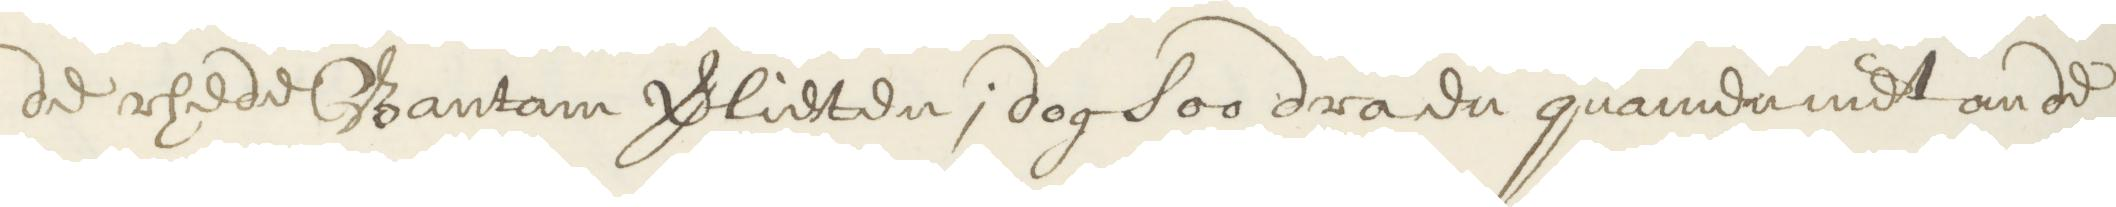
de rhede Bantam verlieten; dog soo dra en quamen met an de
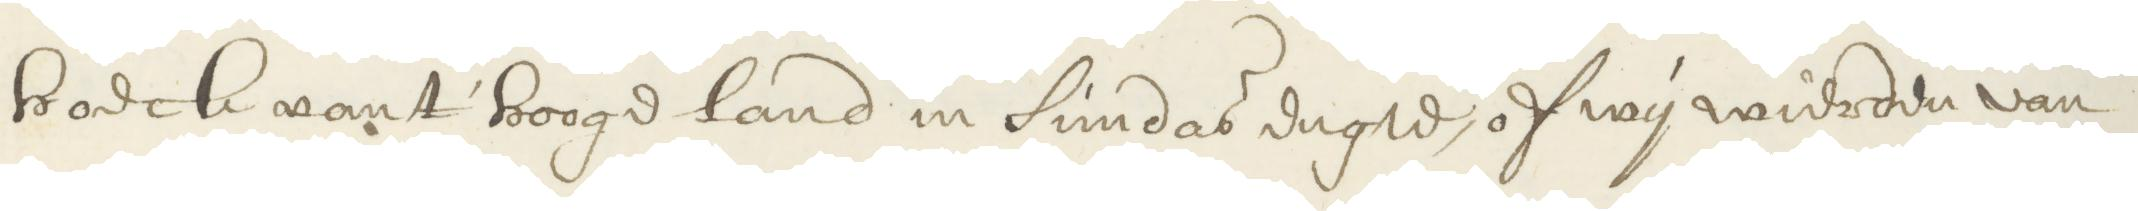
hoeck van t' hooge land in sundas engte, of wij wierden van
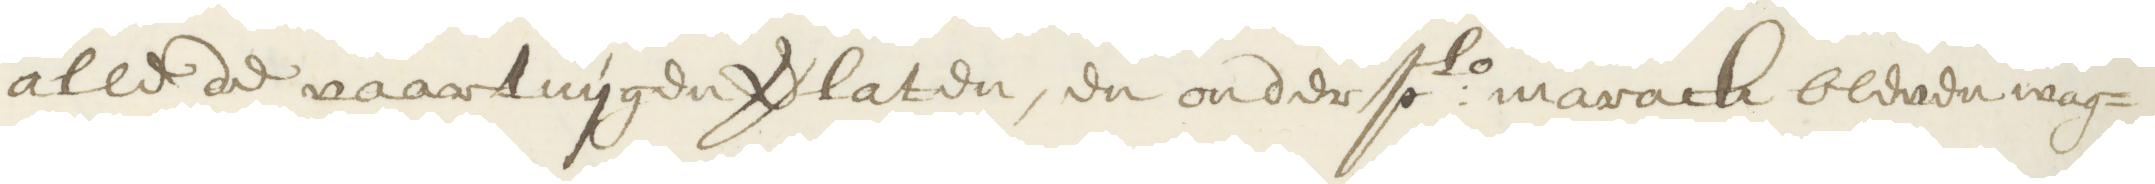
alle de vaartuijgen verlaten, en onder p:lo marack bleven wag=
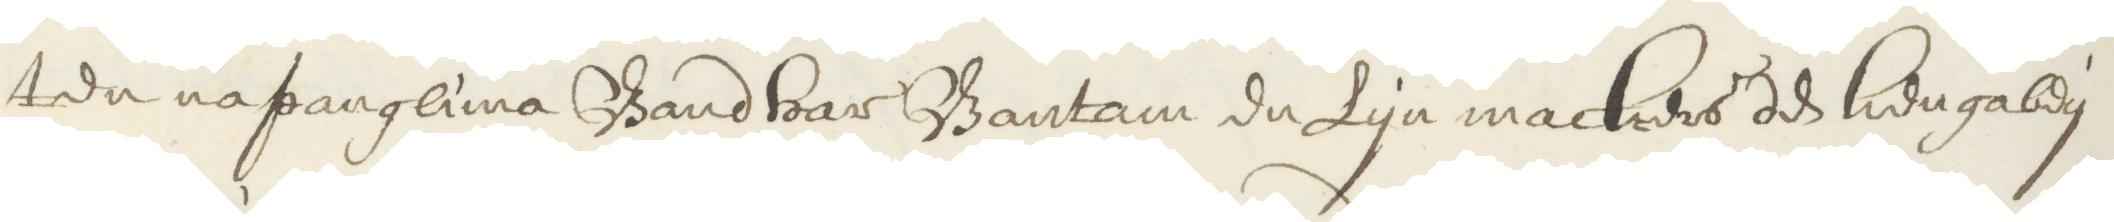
ten na panglima Bandhar Bantam en sijn mackers den kengabeij
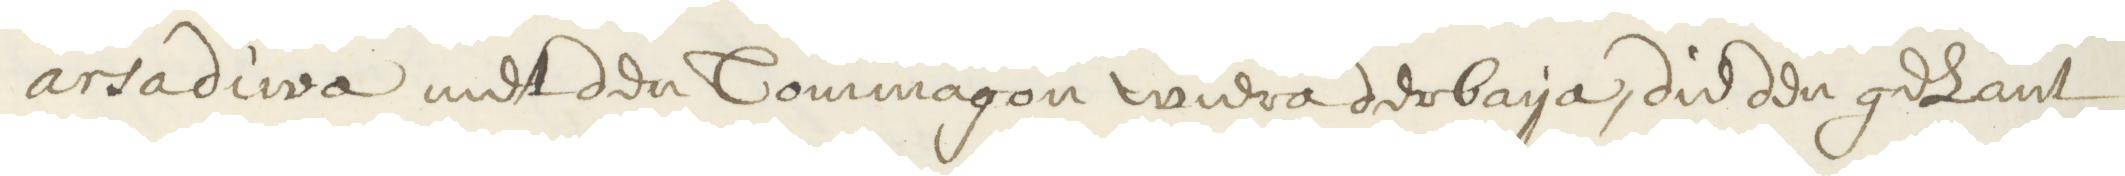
arsadiwa met den Tommagon wiera derbaija, die den gezant
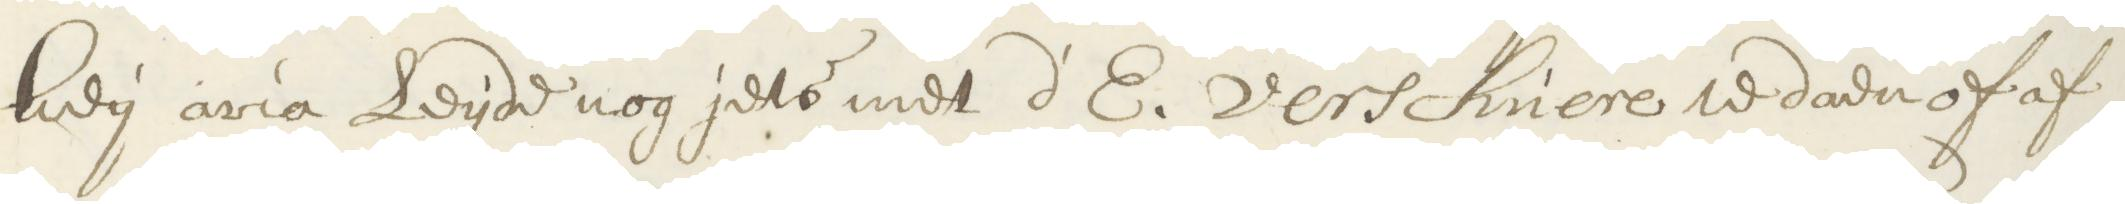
keij aria Leijde nog jets met d’ E. verschuere te doen of af
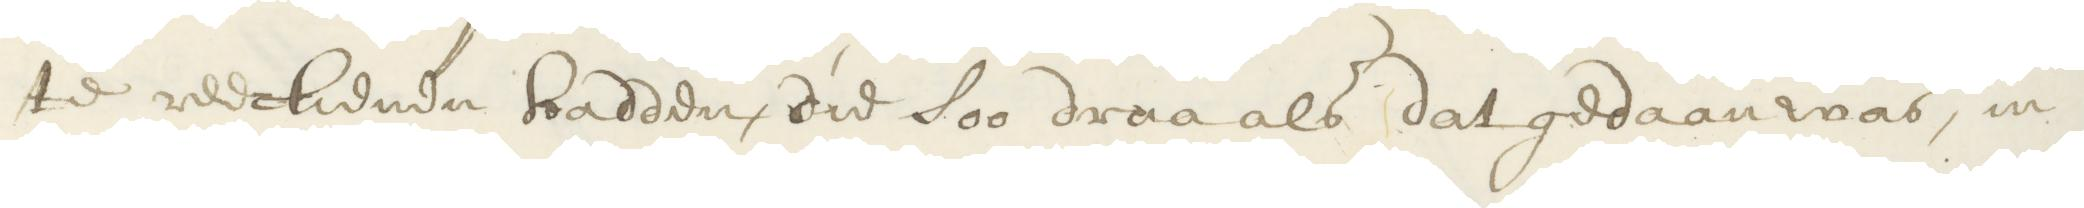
te reeckenen hadden, die soo draa als dat gedaan was, in
